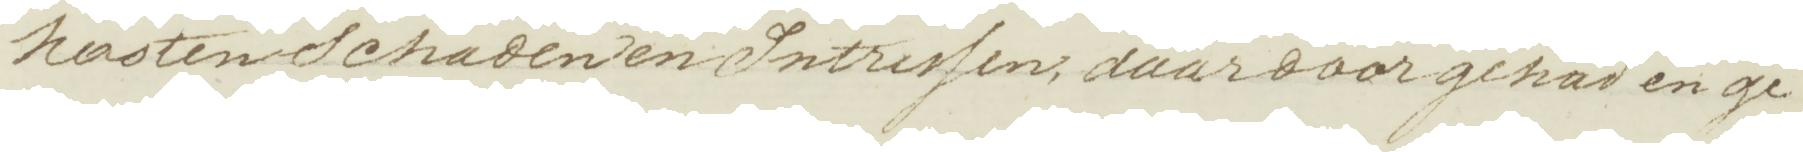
kosten schaden en Jntressen, daardoor gehad en ge
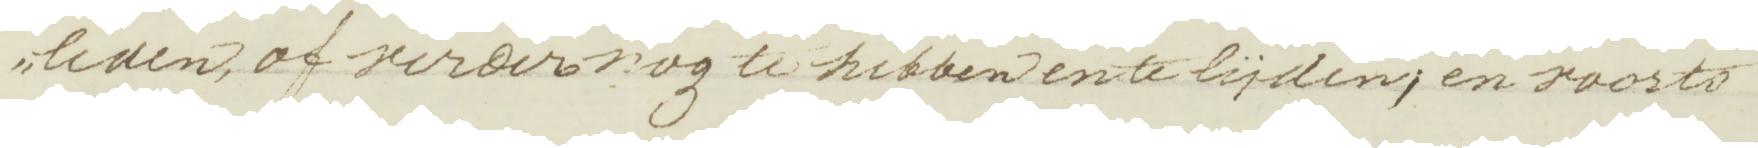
„leden, of verder nog te hebben en te lijden; en voorts
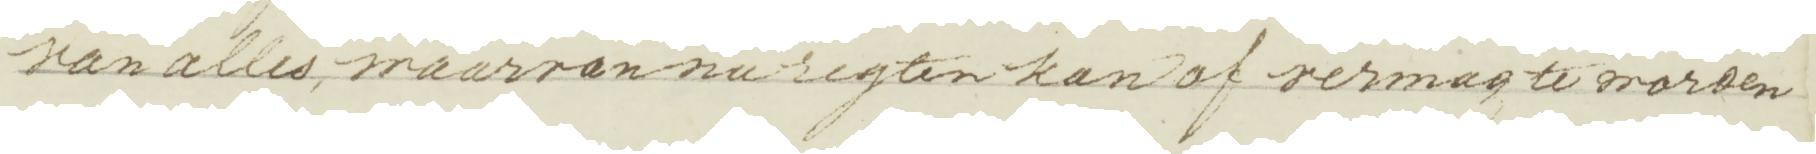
van alles, waarvan na regten kan of vermag te worden
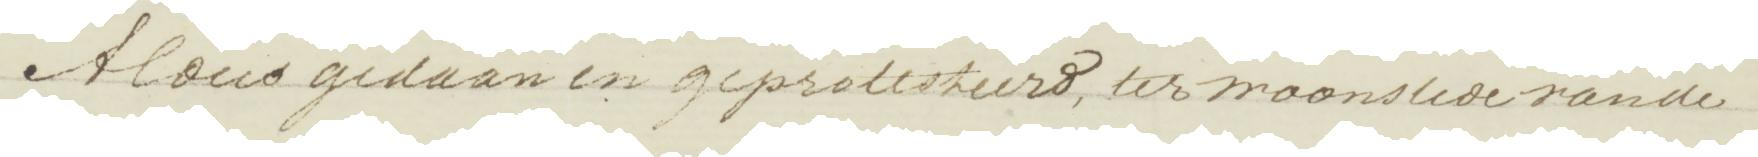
Aldus gedaan en geprotesteerd, ter woonstede van de
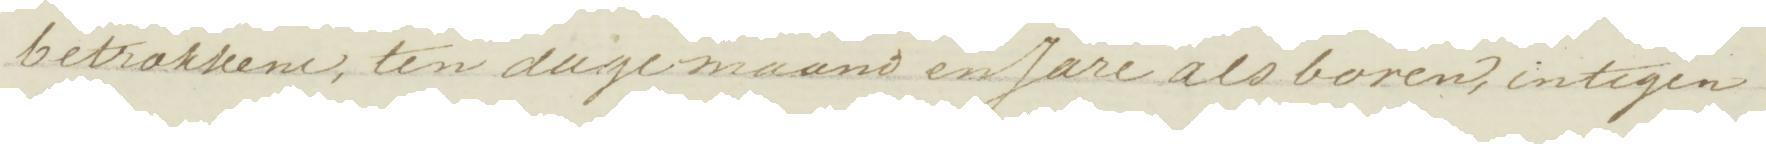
betrokkene, ten dage maand en Jare als boven, integen
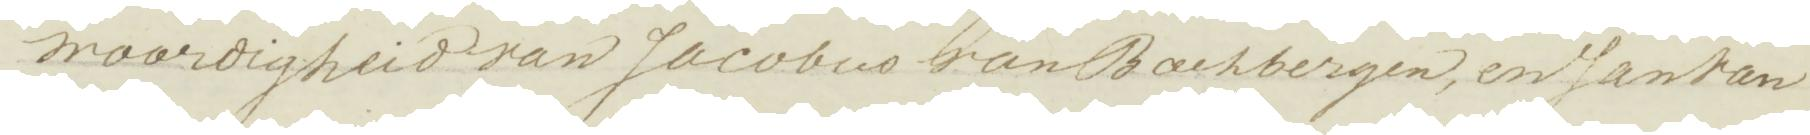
woordigheid van Jacobus van Boetbergen, en Jan van
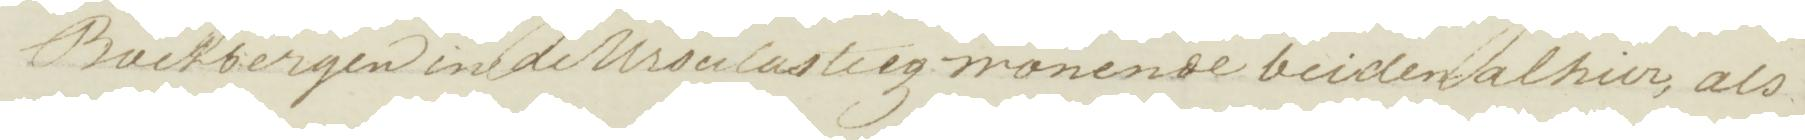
Boetbergen in de Ursulasteeg wonende beiden alhier, als
